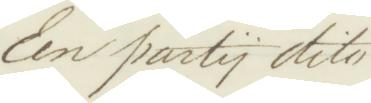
Een partij dito
